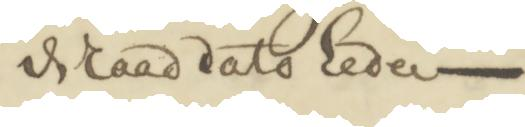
en raad dato heden
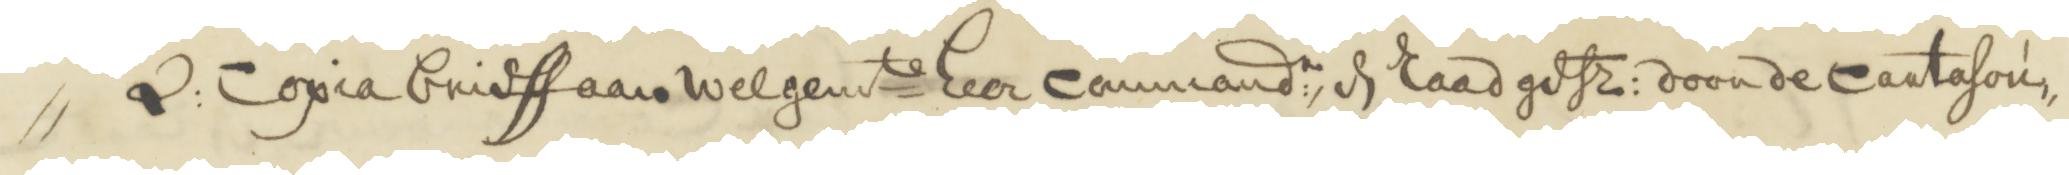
„ 2: copia brieff aan wel gem=te heer Command:r, en raad gesz: door de cartasou„
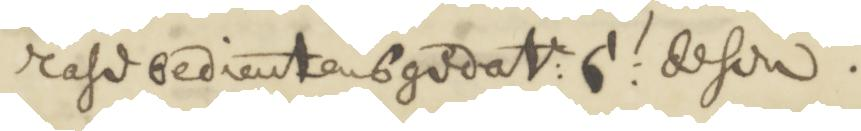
rase bedientens gedat:t 5:' deser
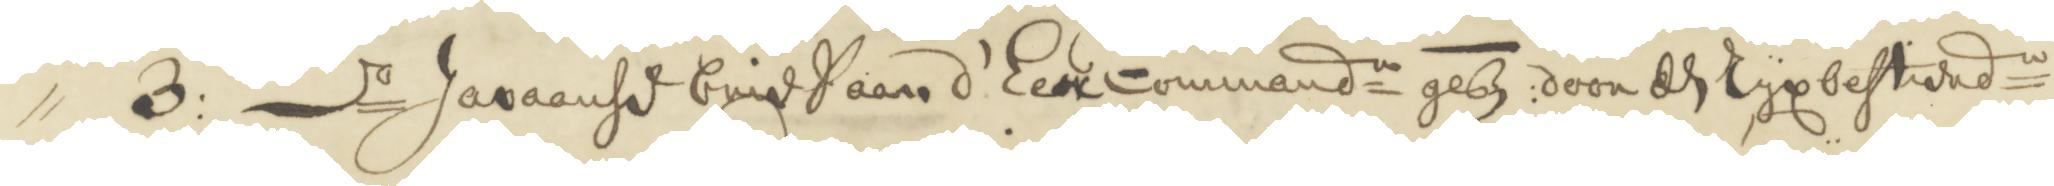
„ 3: d=o Javaanse brief aan d’ heer command=r gess: door den rijx bestierd=r
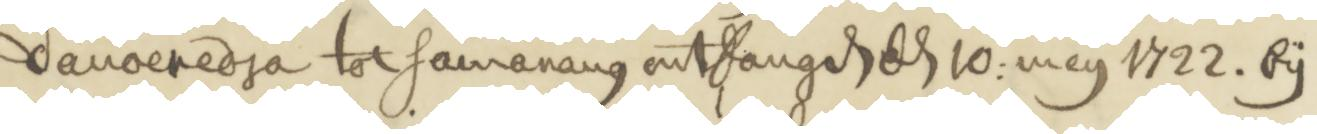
danoeredja tot Samarang ontfangen den 10:' meij 1722. bij
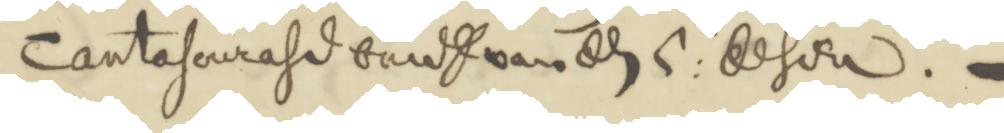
Cartasourase brief van den 5:' deser. —
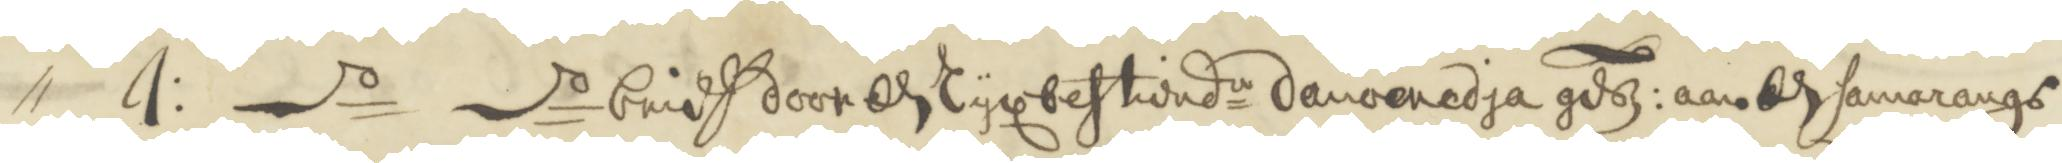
„ 4: d=o d=o brief door den rijx bestierd=r danoeredja gesz: aan den Samarangs
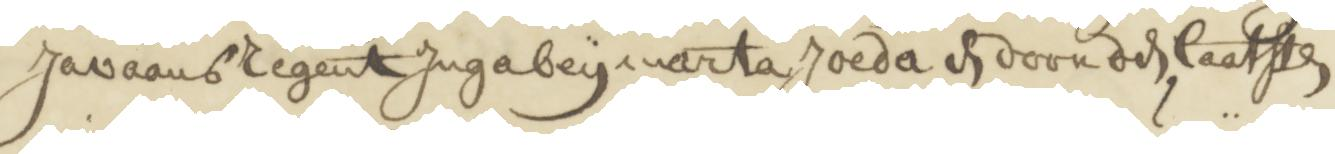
Javaans regent Jngabeij marta Joeda en door den laatsten
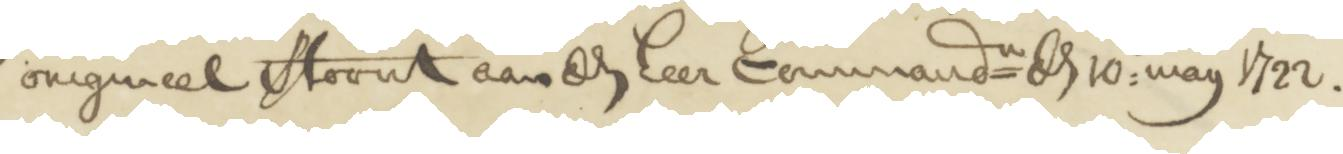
origineel vertoont aan den heer command=r den 10:' maij 1722
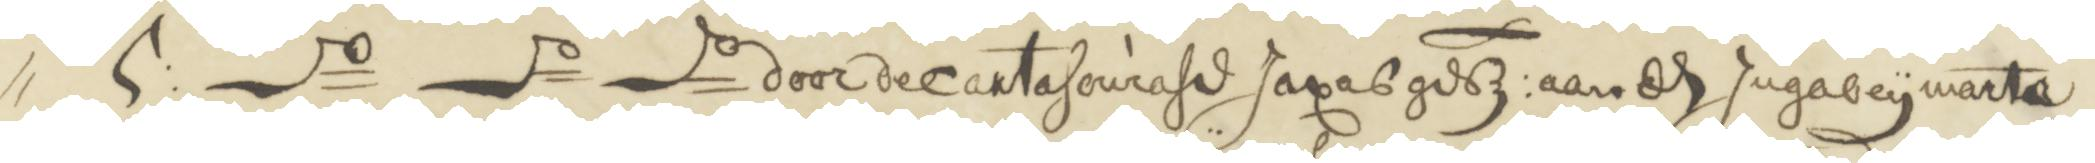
„ 5: d=o d=o d=o door de cartasourase Japas gesz: aan den Jngabeij marta
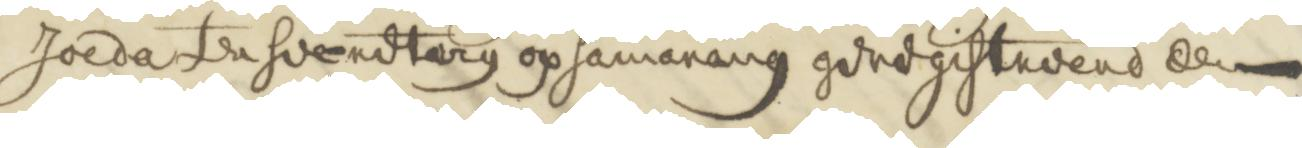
Joeda ter Secretarij op Samarang geregistreerd den
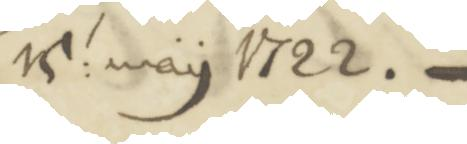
15:' maij 1722. —
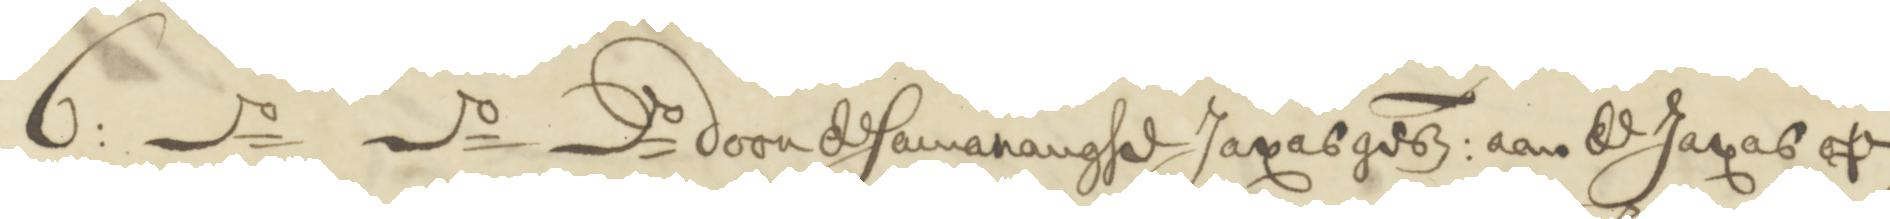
6: d=o d=o d=o door de Samarangse Japas gesz: aan de Japas op
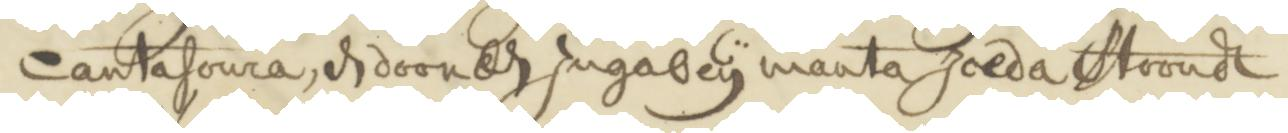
Cartasoura, en door den Jngabeij marta Joeda vertoondt
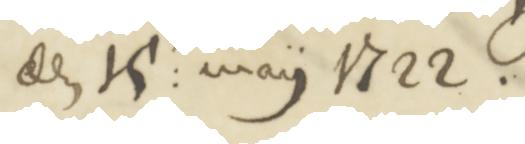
den 15:' maij 1722.
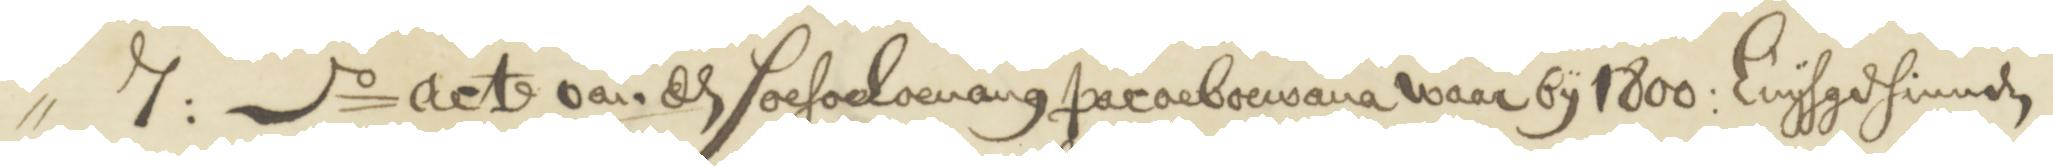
„ 7: d=o acte van den Soesoehoenang pacoeboewana waar bij 1800: huijsgesinnen
